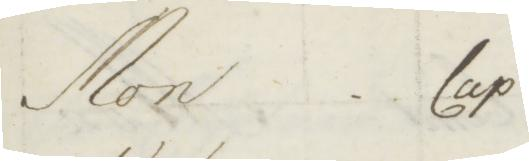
Mon - Cap
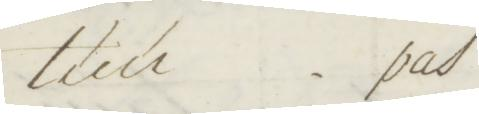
tuu - pas
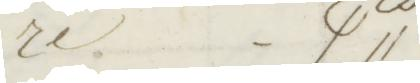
re - p„ls
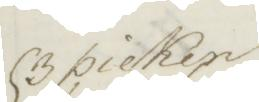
3 pieken
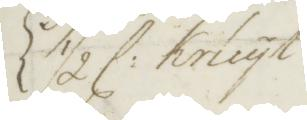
½ C: kruijt
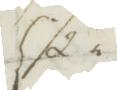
/2 „
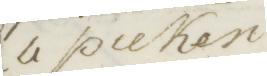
4 pieken
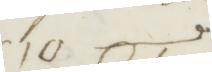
10 _o
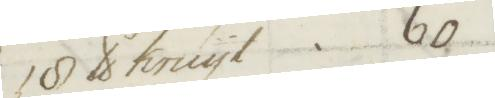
18 lb kruijt . 60
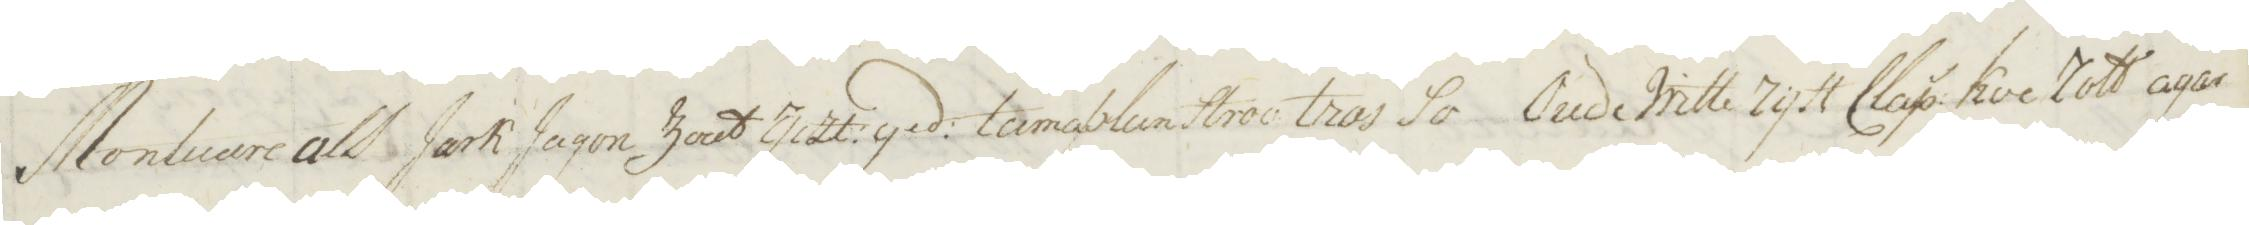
Montuure als Jark Jagon Zout ^gezt: ged: tama plan stroo tras so Oude witte rijst Clap:s koe rott agar
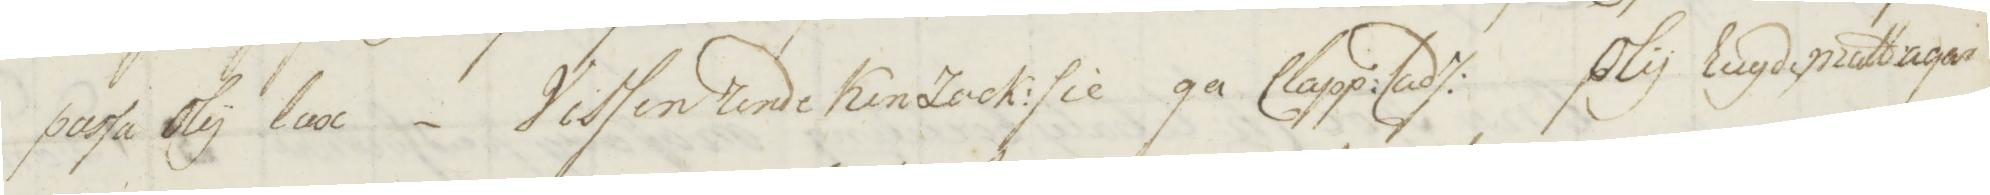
passa olij lax – Vissen rinde ken zack: sie ga Clapp: Cadj: /olij huyde matt agar
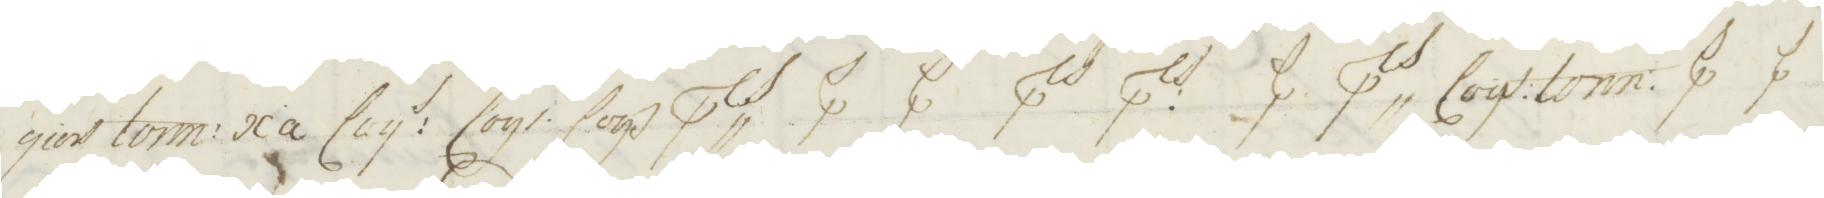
giers tonn: xa Coy:s Coys Coys p„ls ps ps pls p:ls pl p„ls Cog:s tonn: ps ps ps
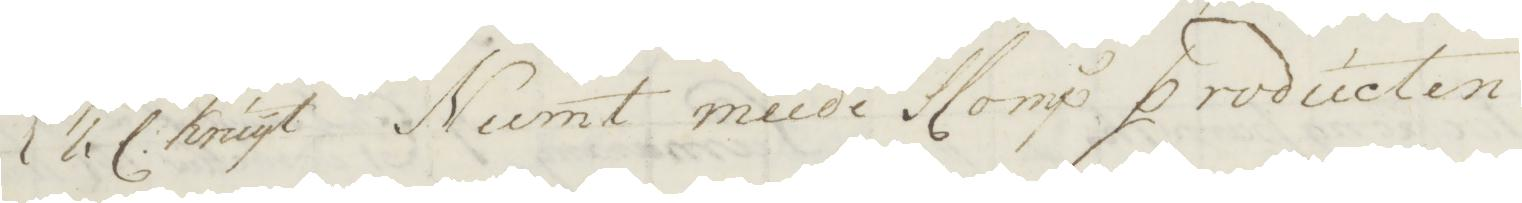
4 C: kruijt Neemt meede sComps producten
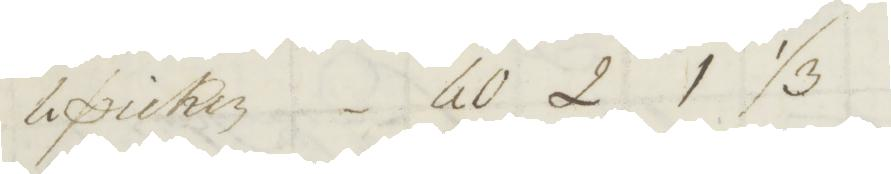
4 pieken — 40 2 1 1/3
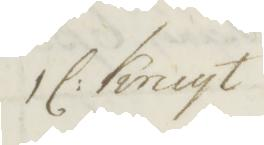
1 C: kruyt
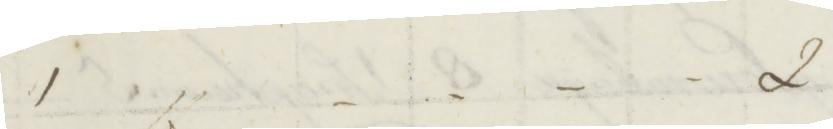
1 – – – – 2
